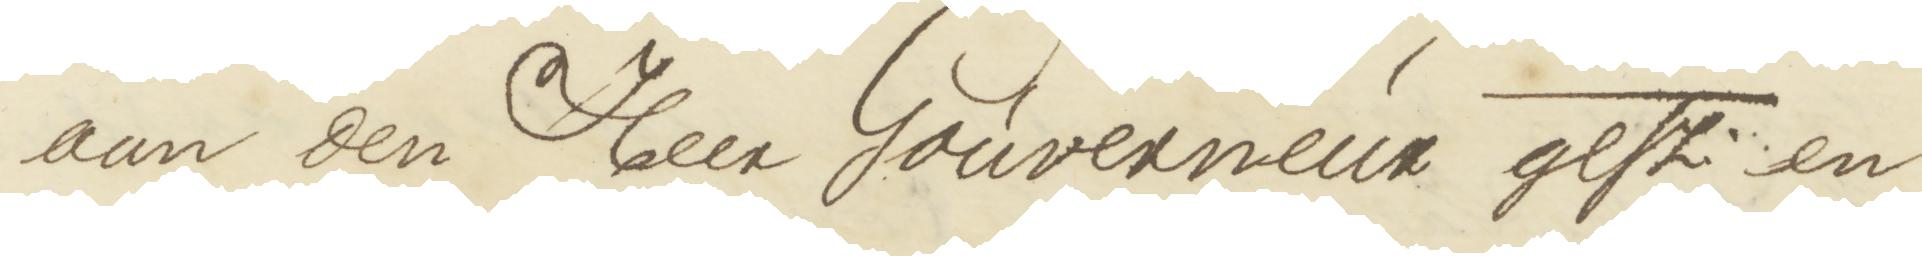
aan den Heer Gouverneur gesz: en
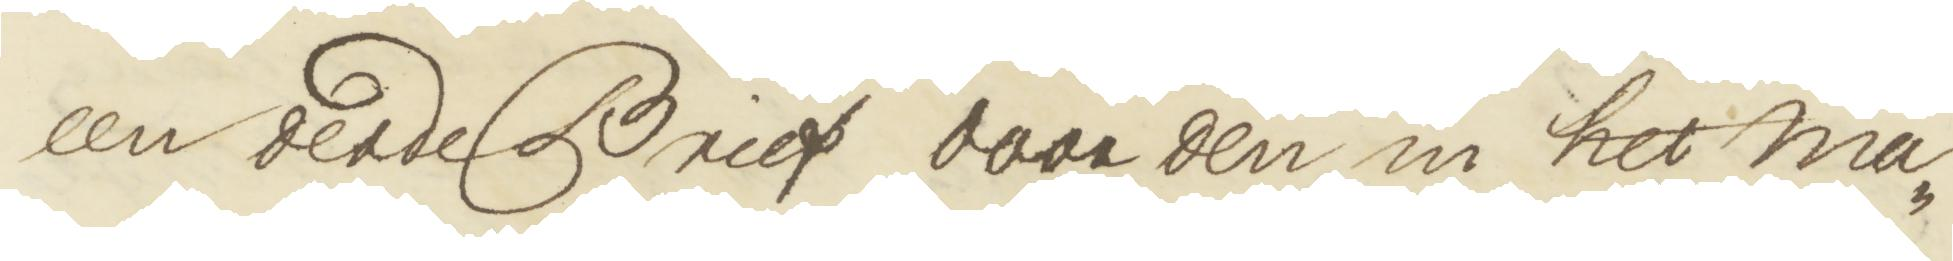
een derde Brief door den in het ma„
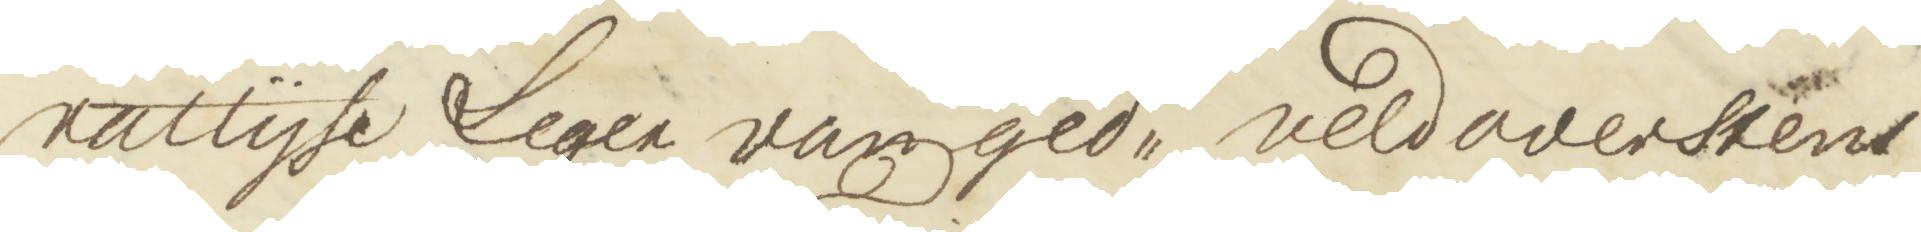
rattijse Leger van ged„e veldoverstens
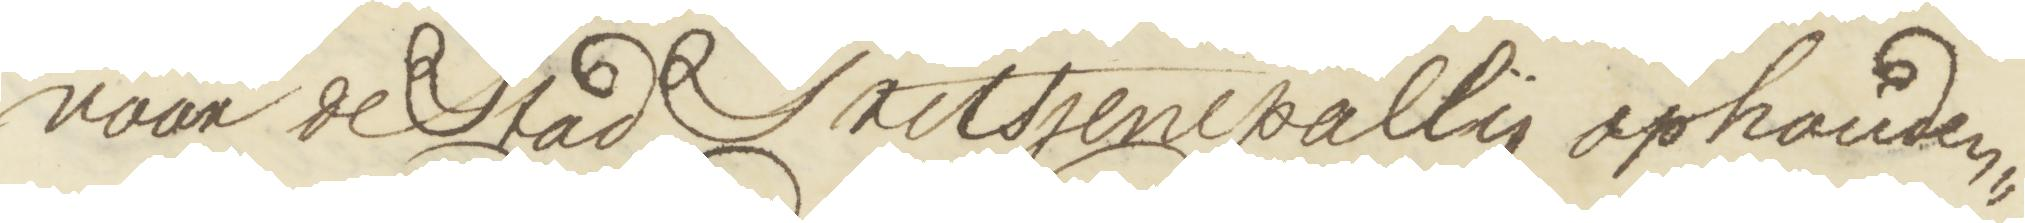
voor de stad Tritsjenepallij ophouden„
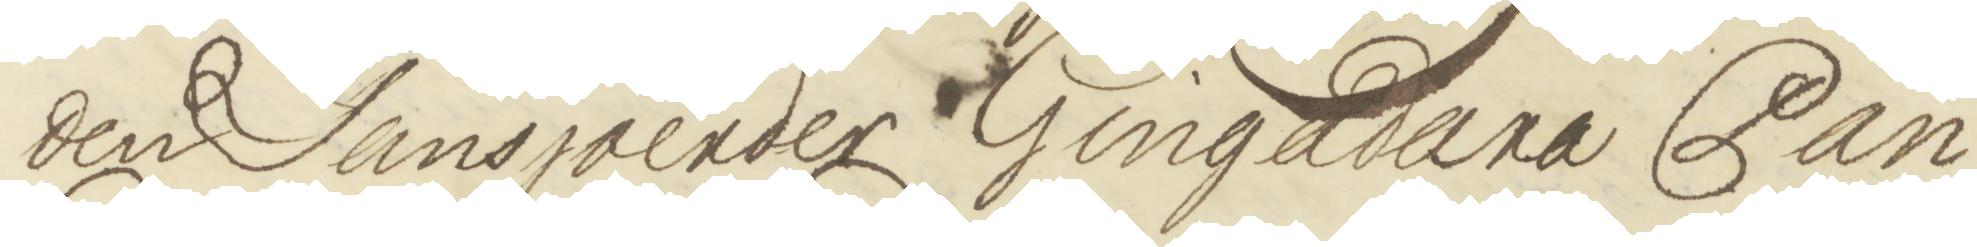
den Tansjoerder Gingadara Pan
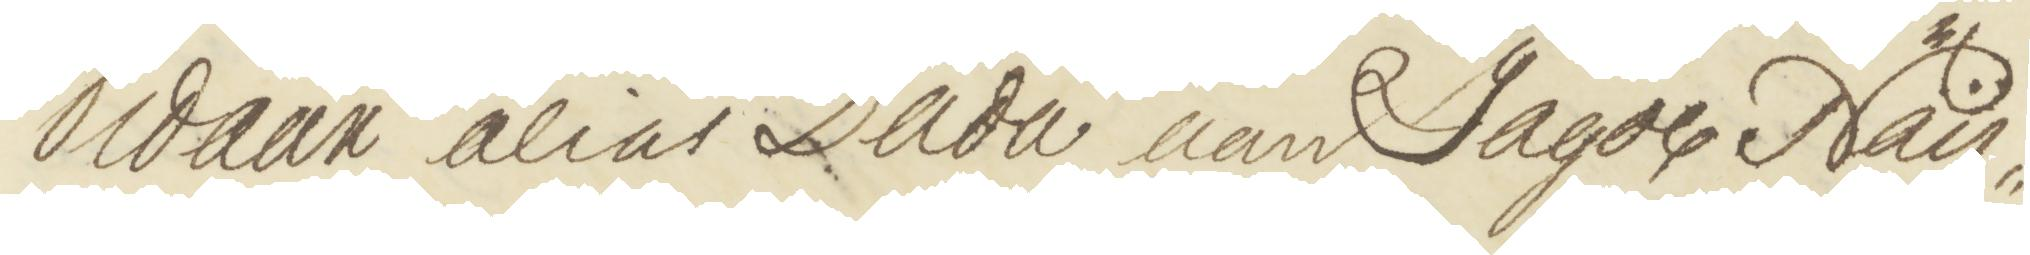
didaar alias Dada aan Iagoe Naij„
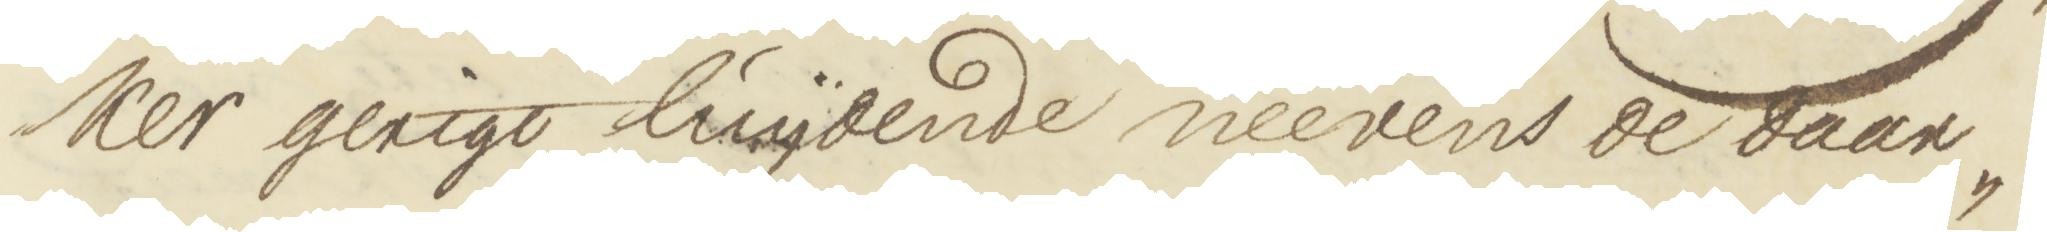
„ker gerigt luijdende neevens de daar„
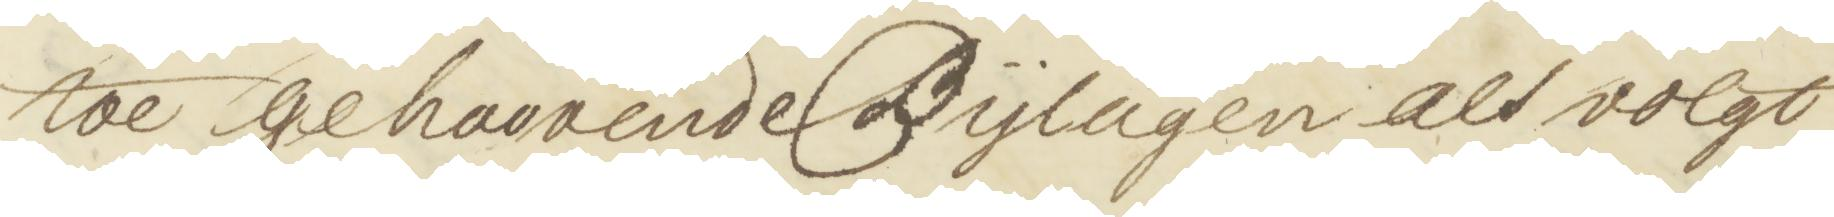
toe gehoorende Bijlagen als volgt
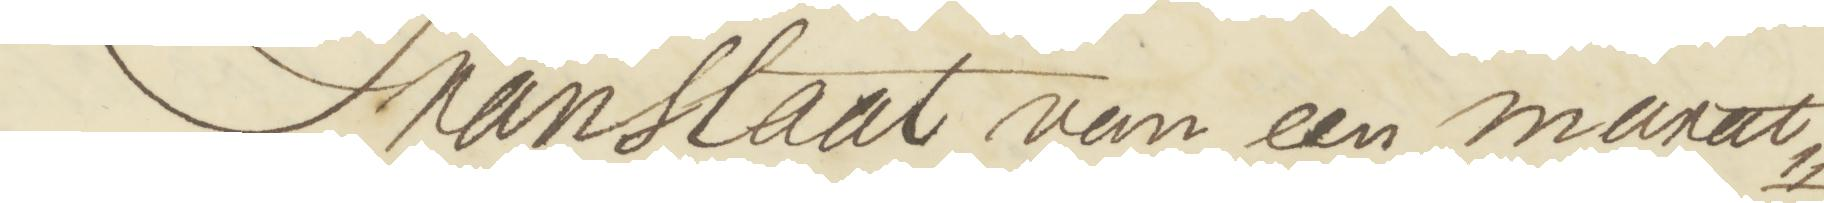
Translaat van een marat„
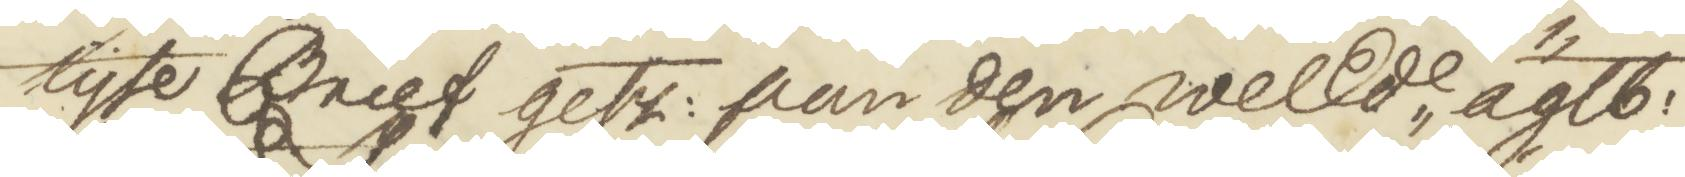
tijse Brief gesz: aan den welEd„e agtb:
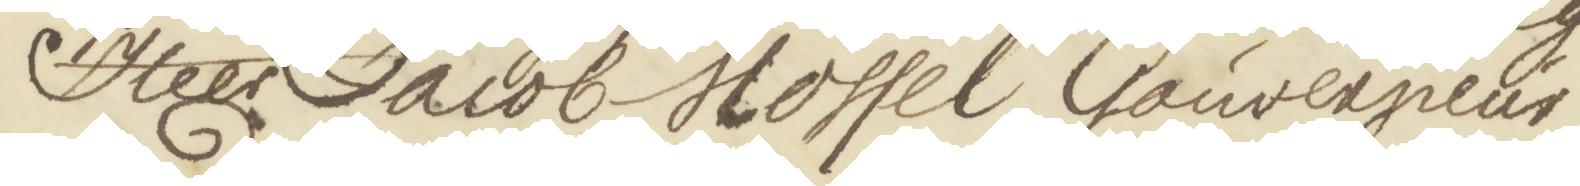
Heer Iacob Hossel Gouverneur
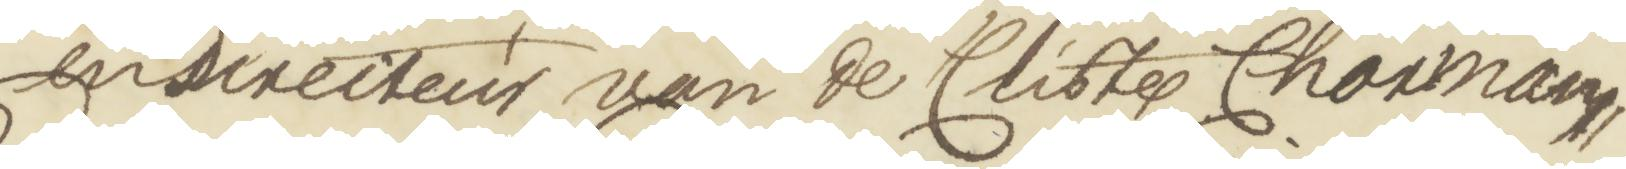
en directeur van de Custe Chorman„
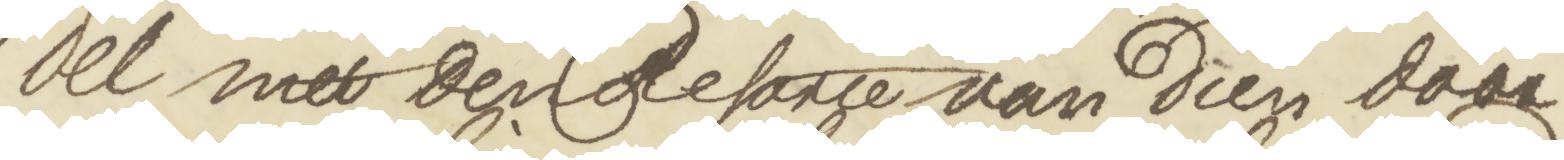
del met den Resorce van dien door
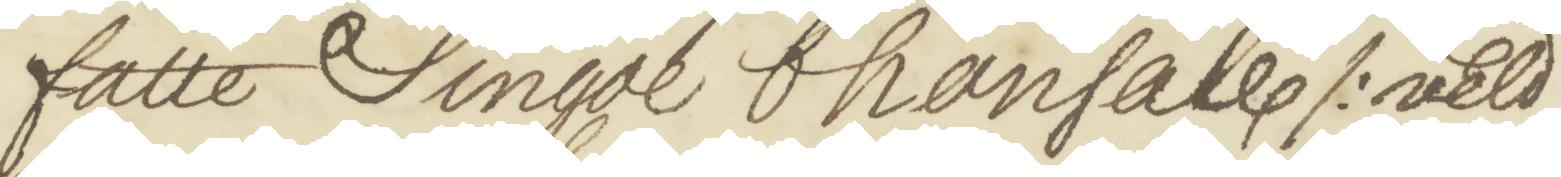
fatte Singoe bhansale /:veld
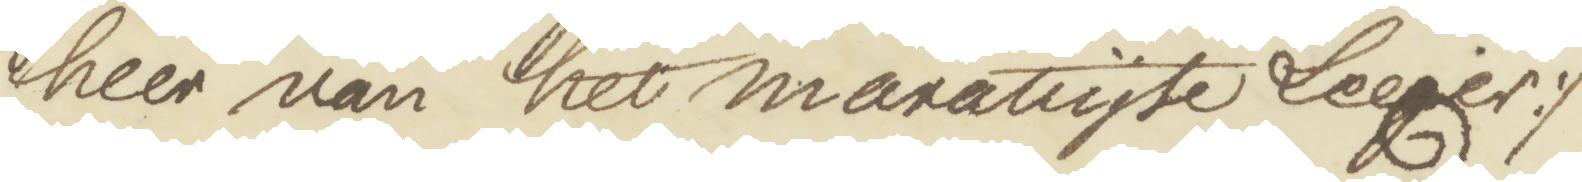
heer van het marattijse Leeger:/
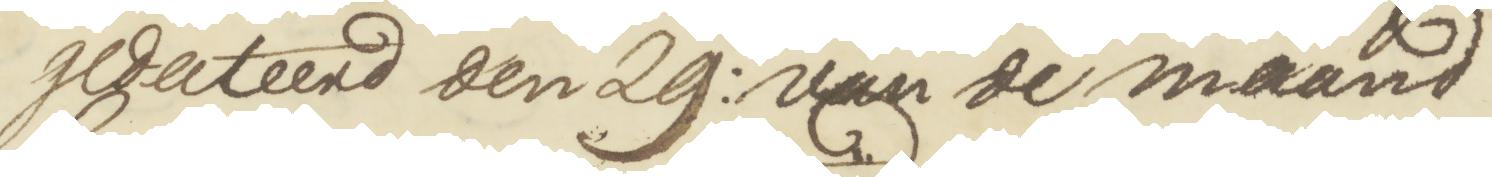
gedateerd den 29: van de maand
